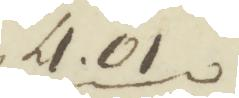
4.01
